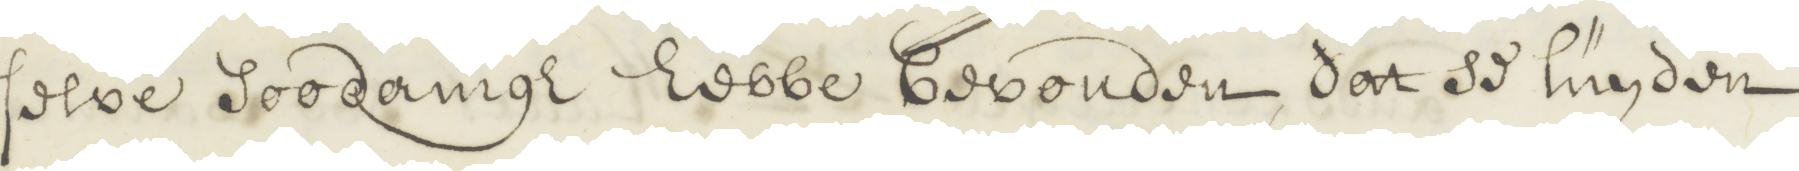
selve soodanigh hebbe bevonden dat se luyden
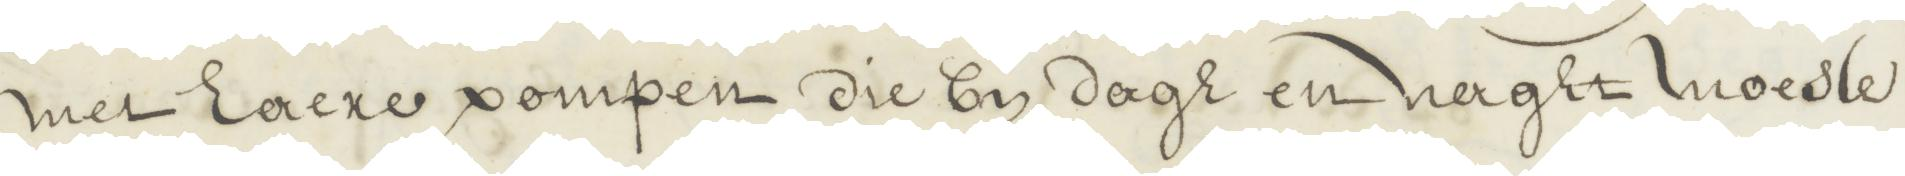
met haere pompen, die by dagh en naght moeste
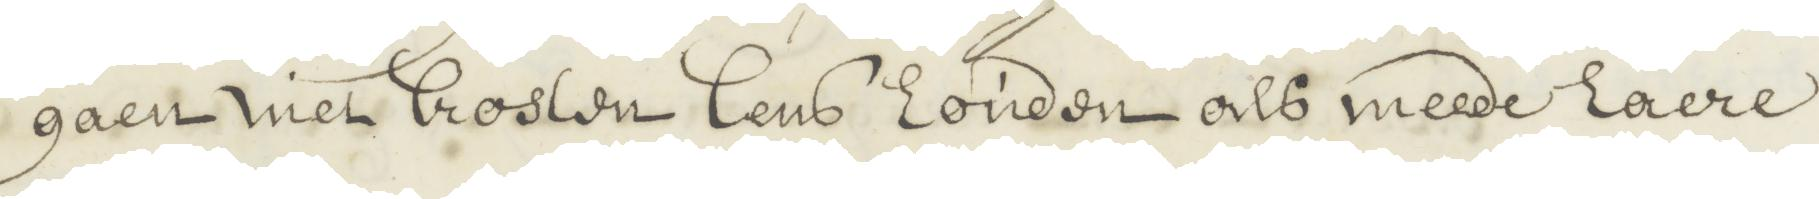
gaen niet kosten lens houden als meede haere
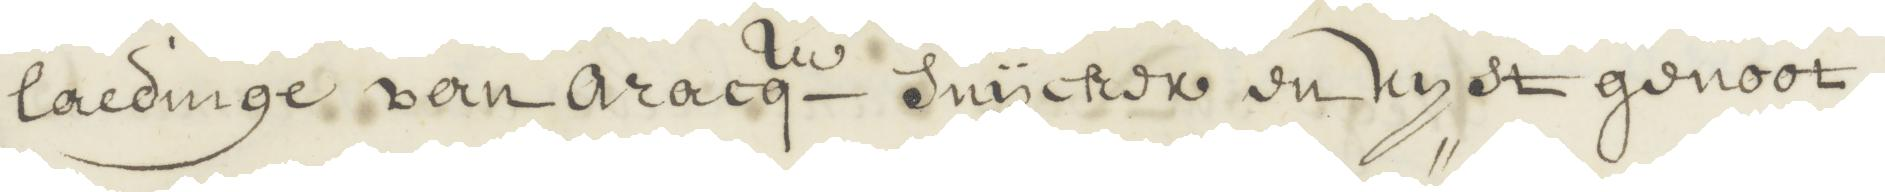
laedinge van aracq-e suijcker en ryst genoot
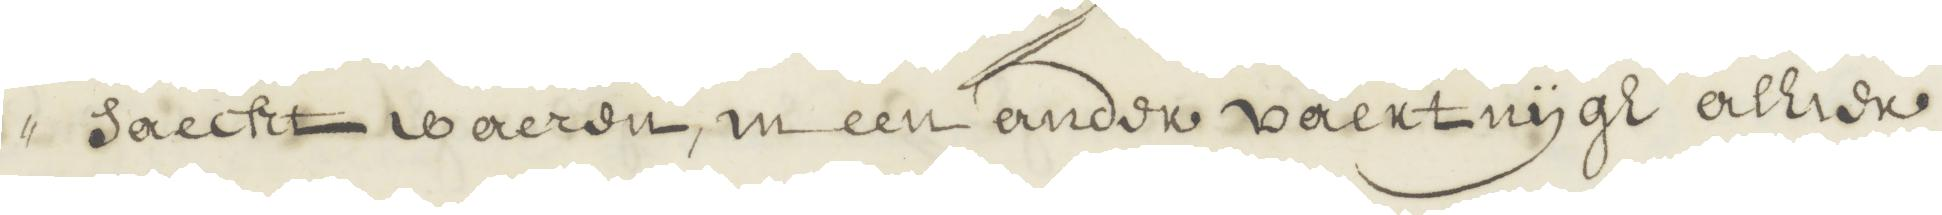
„saeckt waeren, in een ander vaertuijgh alhier
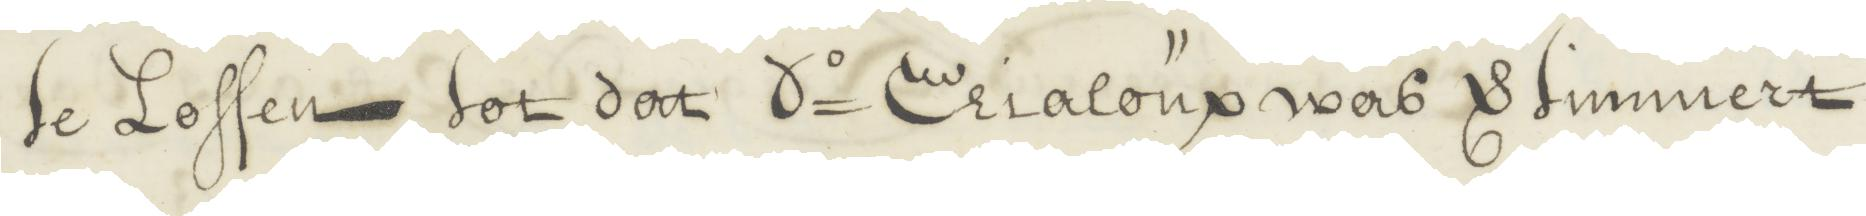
te Lossen, tot dat d=o Chialoup was vertimmert
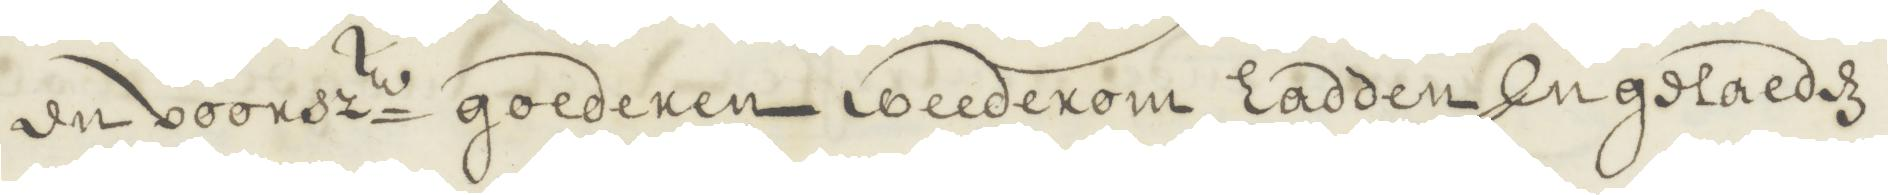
en voorsz=e goederen weederom hadden jngelaeden
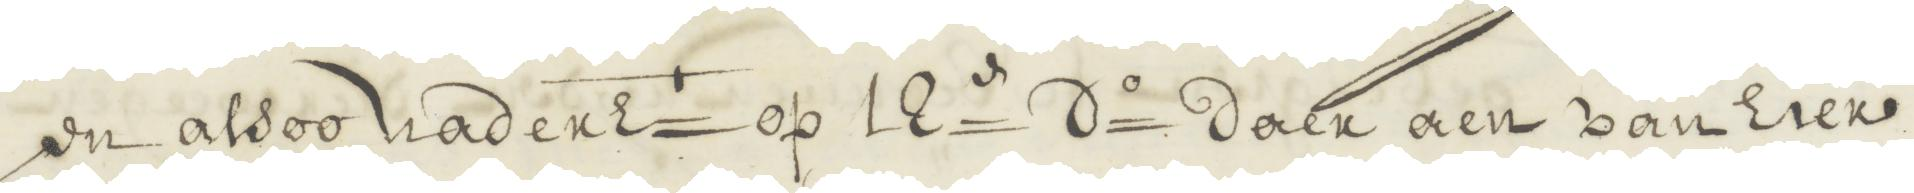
en alsoo naderh=t op 12=en d=o daer aen van hier
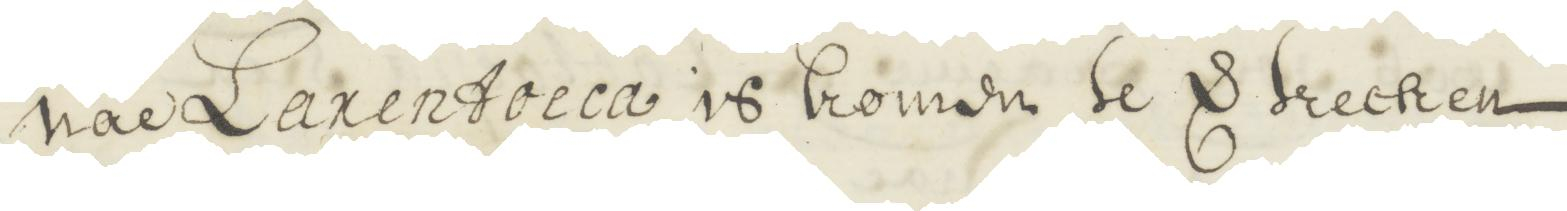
nae Larentoeca is komen te ver trecken
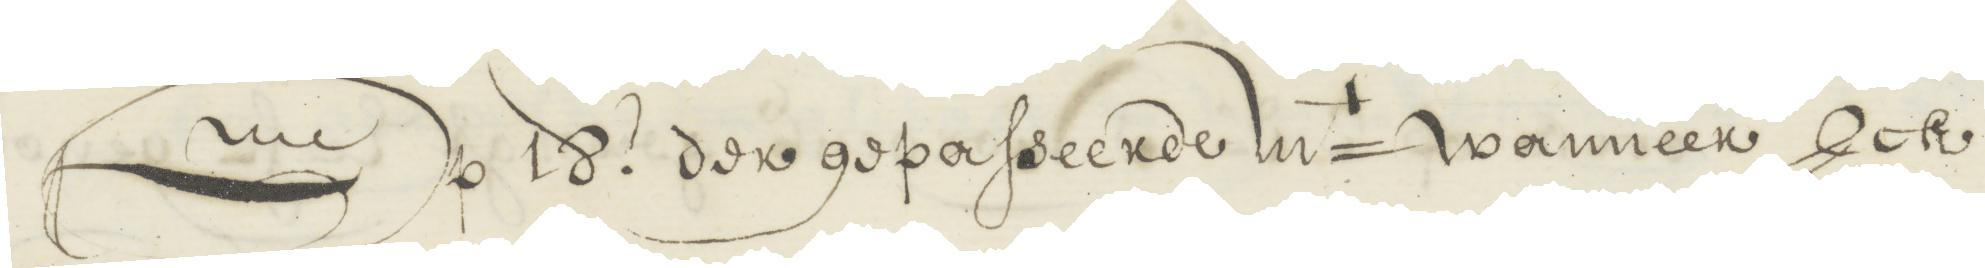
Op 18.' der gepasseerde m=t wanneer jck
